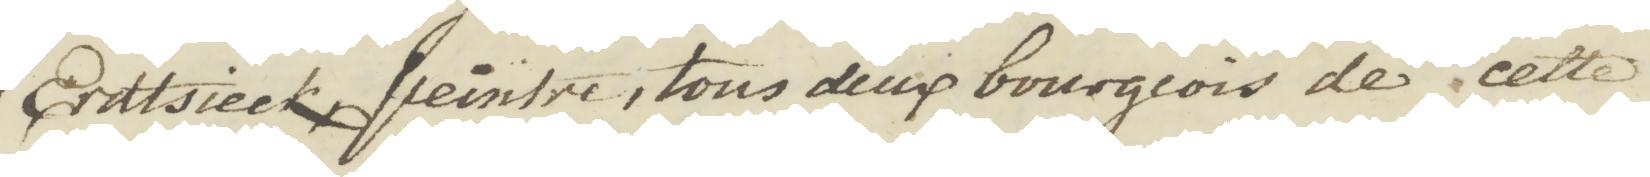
Erdtsieck peintre, tous deux bourgeois de cette
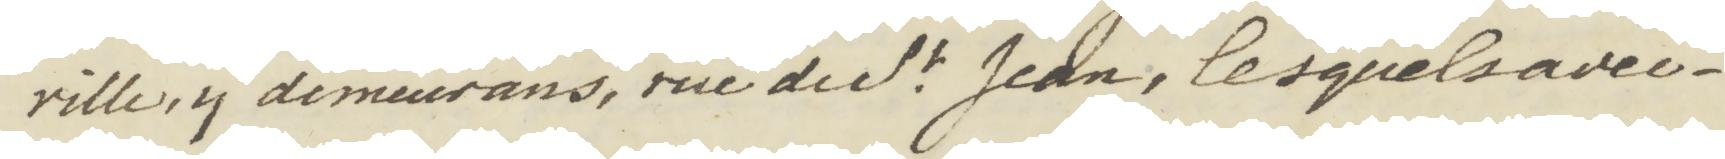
ville, y demeurans, rue de S.t Jean, lesquels avec -
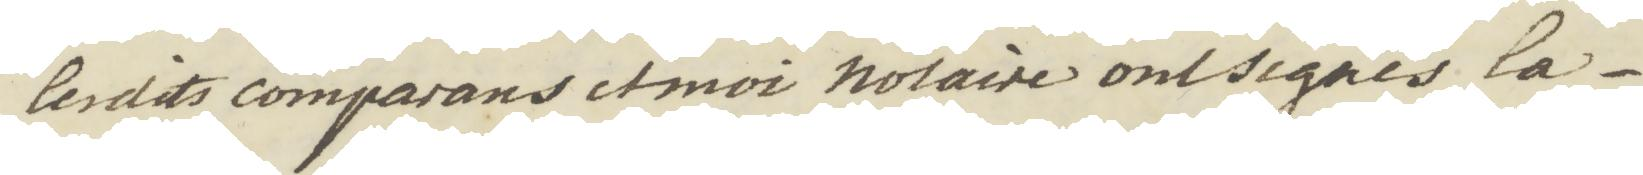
les dits comparans et moi notaire ont signés la -
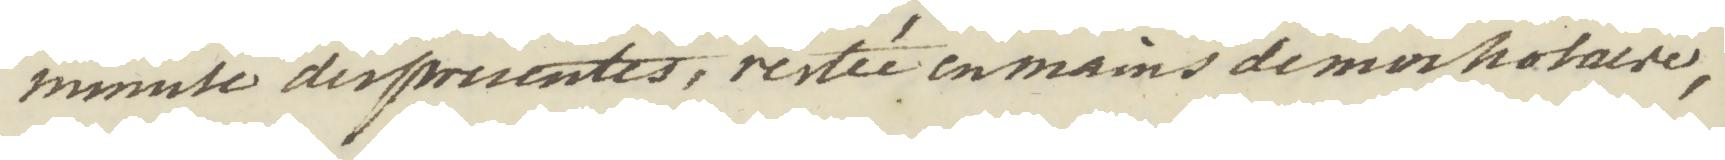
minute disprisentes, resteé en mains de moi notaire,
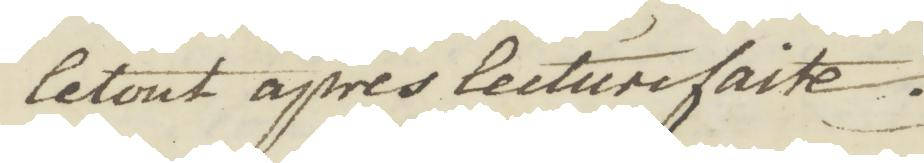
le tout apres lecture faite.
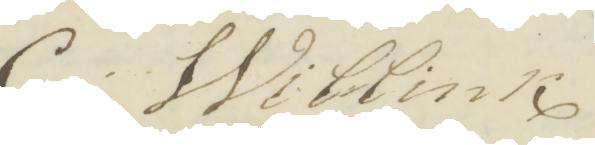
C. Willink
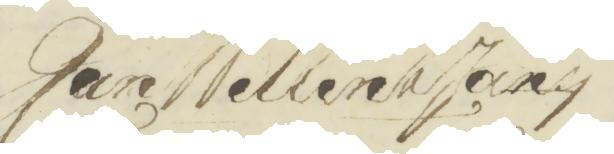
Jan Wellenk Jansz
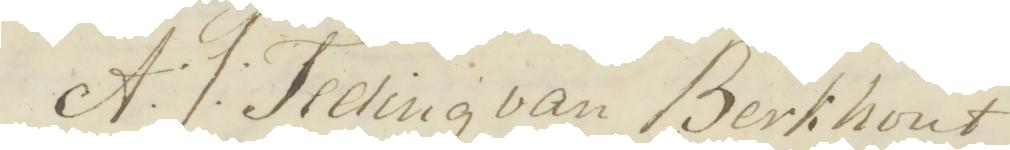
A:J: Teding van Berkhout
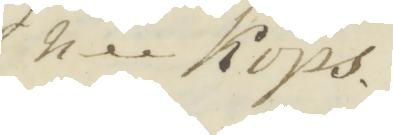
nee Kops
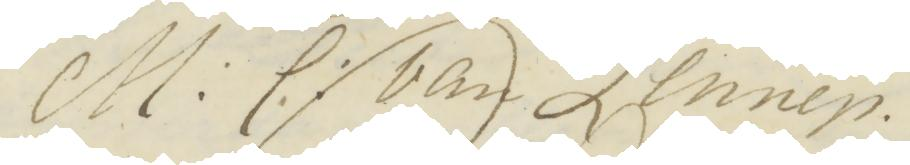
M: C: van Lennep.
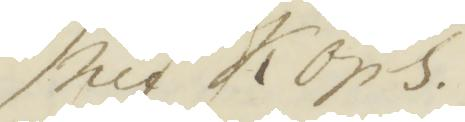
née Kops.
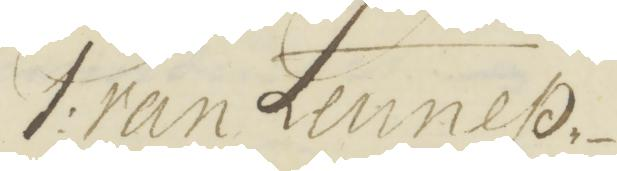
P: van Lennep
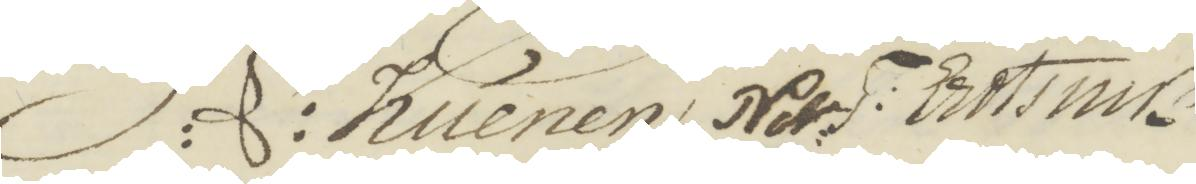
J:P: Kuenen not:s T: Erdtsieck
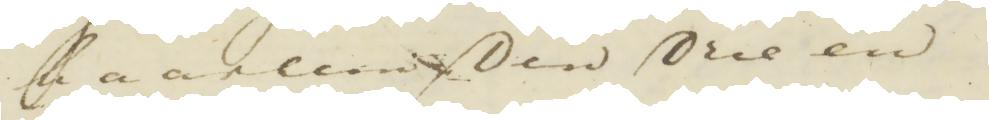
haarlem den drie en
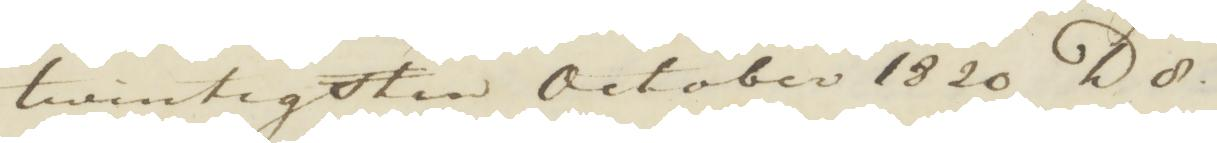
twintigsten October 1820 D 8.
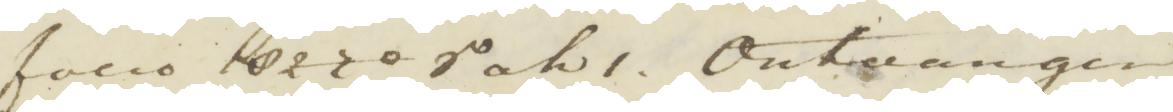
facio 1827 vak 1. Ontvangen
